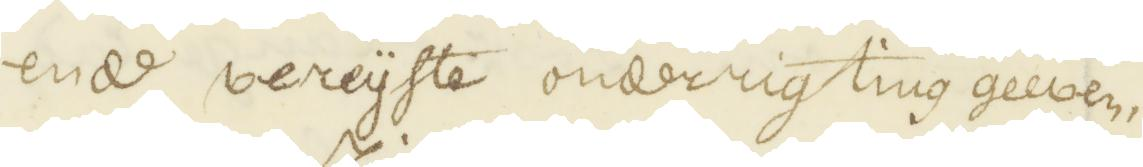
ende vereijste onderrigting geeven
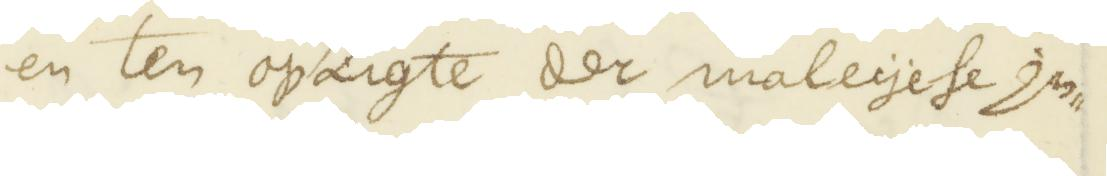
en ten opzigte der maleijese jn„
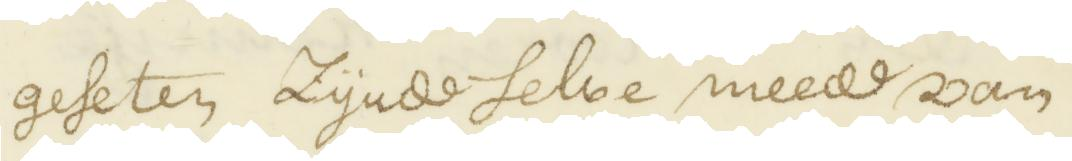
geseten zijnde selve meede van
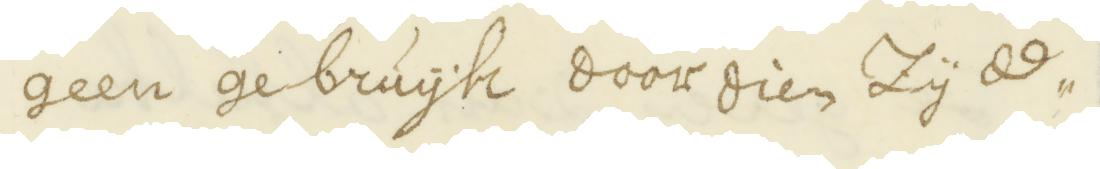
geen gebruijk door dien zij de„
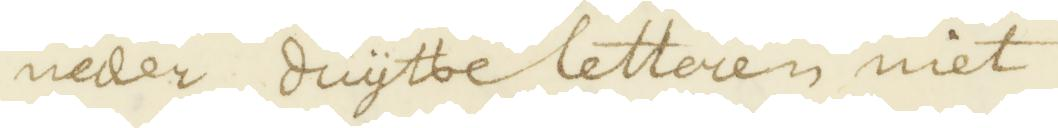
neder duijtse letteren niet
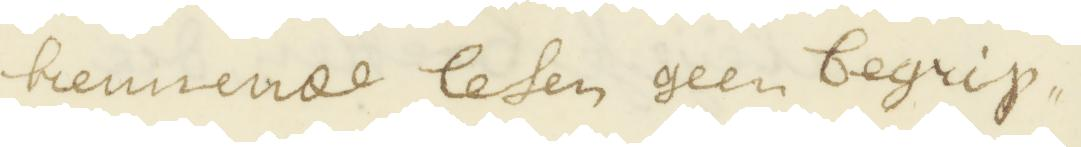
kennende lesen geen begrip„
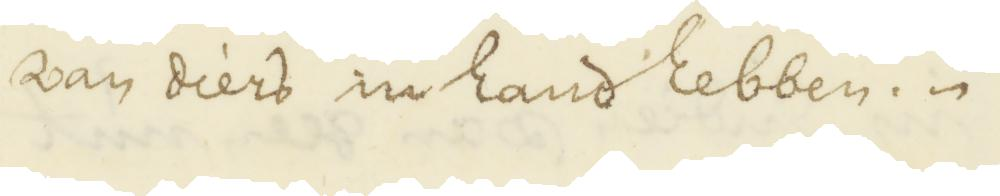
van diers in hand hebben.
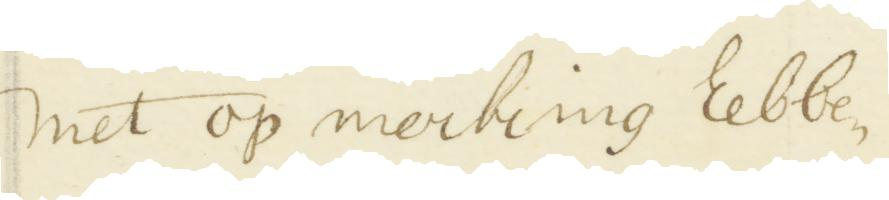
met op merking hebben
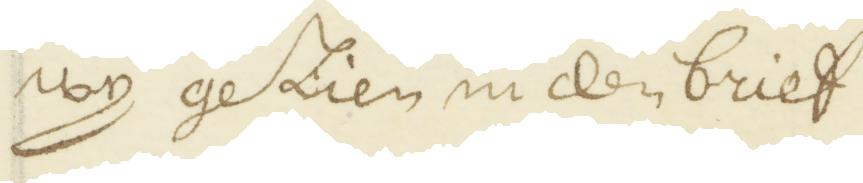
wij gezien in den brief
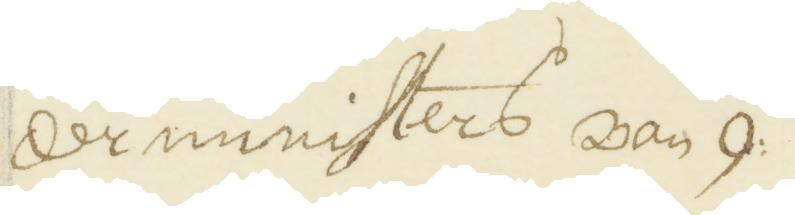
der ministers van 9:
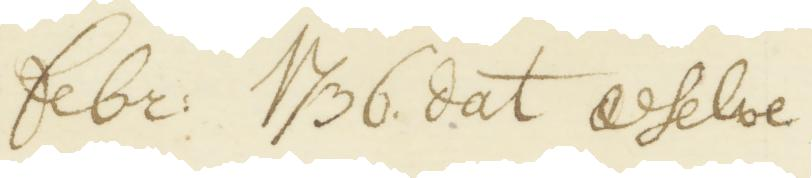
febr: 1736. dat deselve
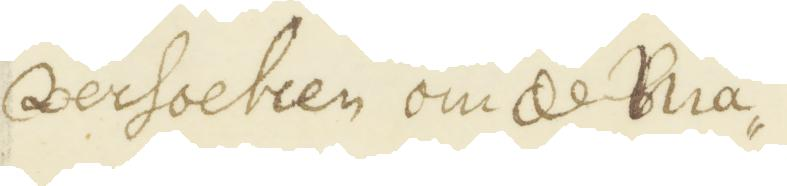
versoeken om de ma„
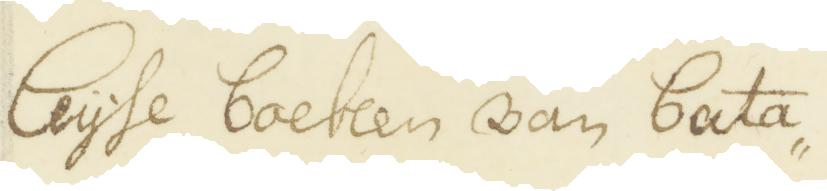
leijse boeken van bata„
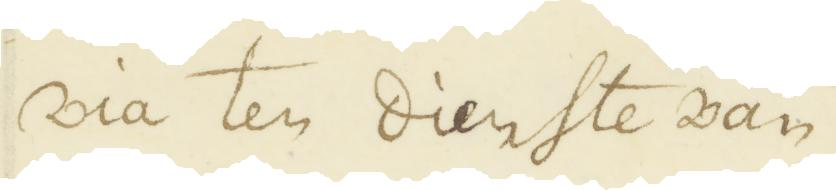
via ten dienste van
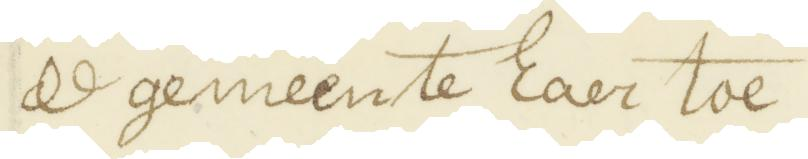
de gemeente haer toe
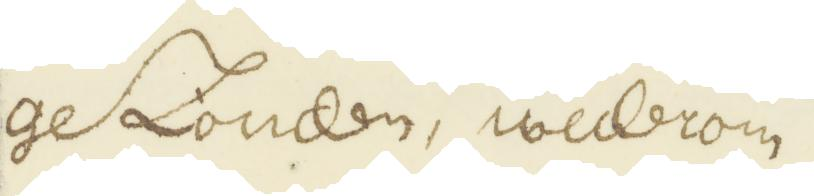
gezonden, wederom
